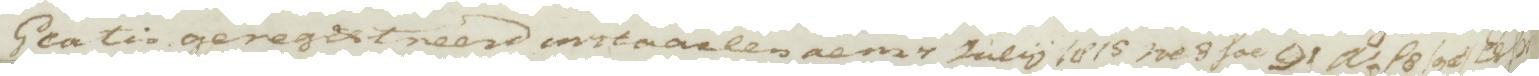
gratis geregistreerd in Haarlem den 7 Julij 1815 vol 8 fol 91 a. ƒ8 / get/ les
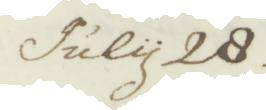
Julij 28.
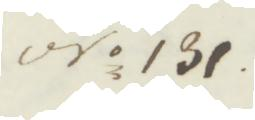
N=o 131.
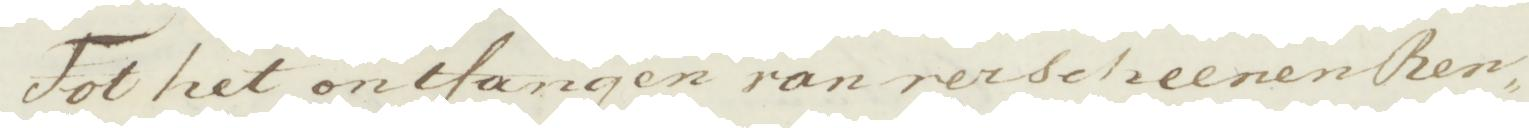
Tot het ontfangen van verscheenen Ren=
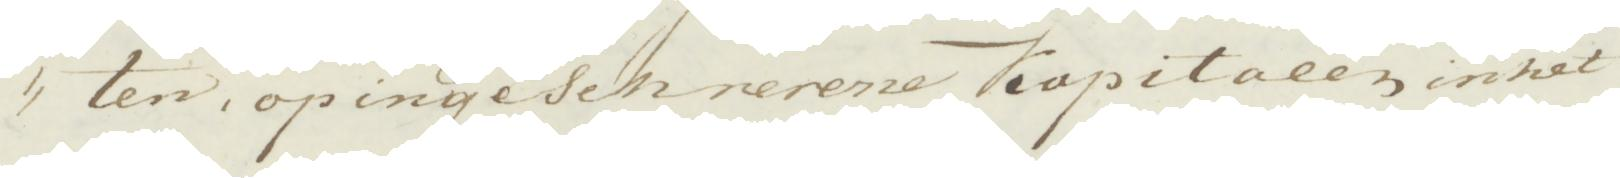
„ten op ingeschrevene Kapitalen in het
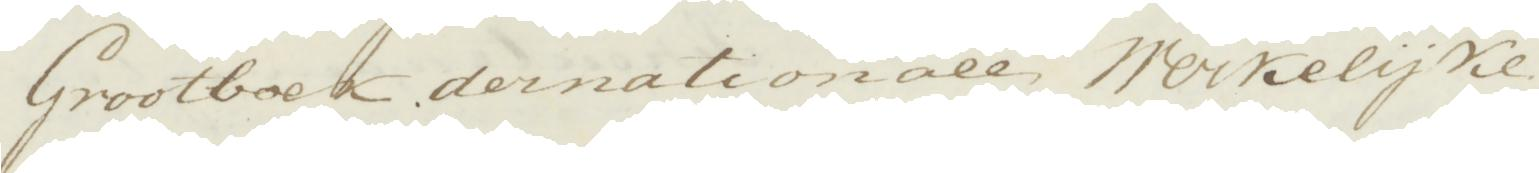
Grootboek dernationale Werkelijke
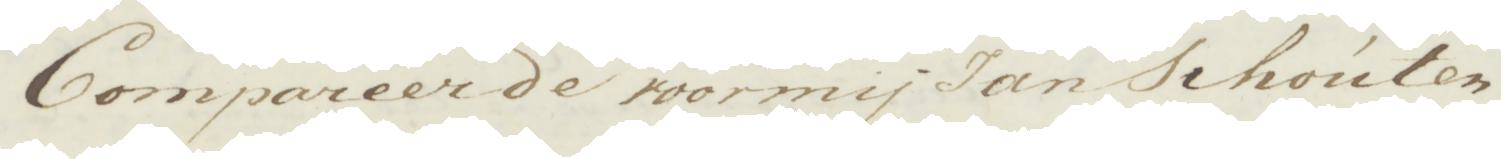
Compareerde voor mij Ian schouten
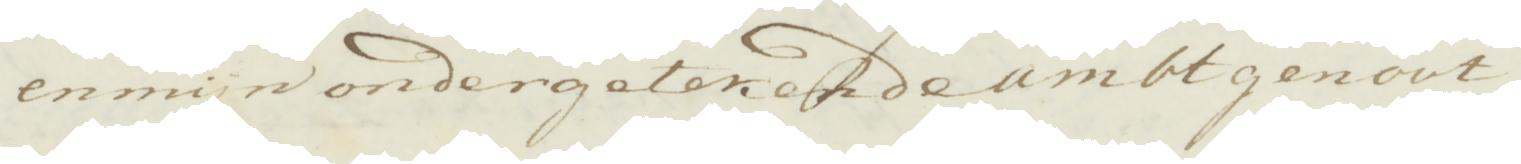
en mijn ondergetekende ambtgenoot
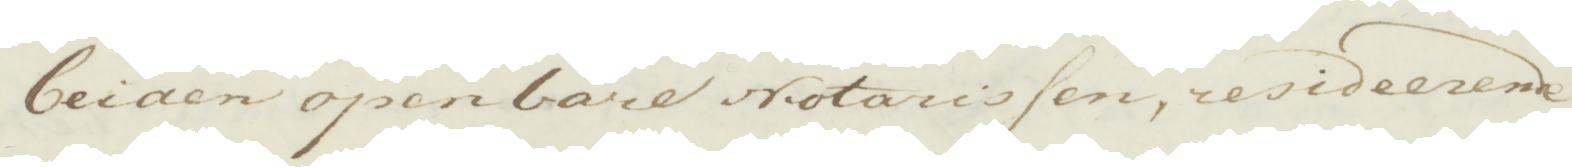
beiden openbare Notarissen, resideerende
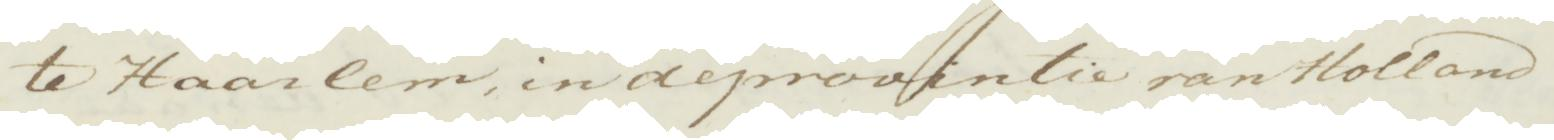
te Haarlem, in de provintie van Holland
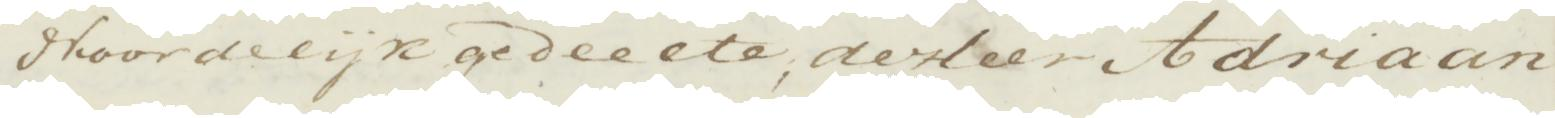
Noordelijk gedeelte, de Heer Adriaan
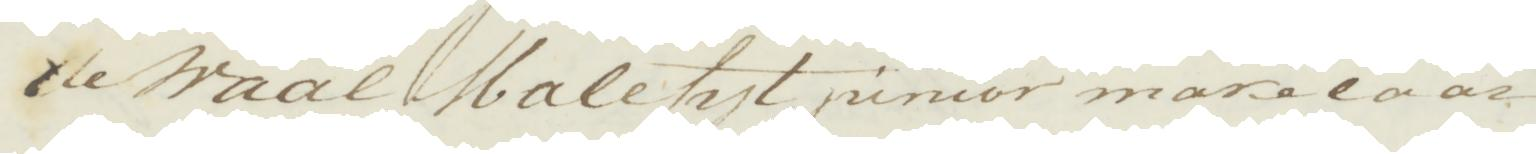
de Waal Malefyt junior makelaar
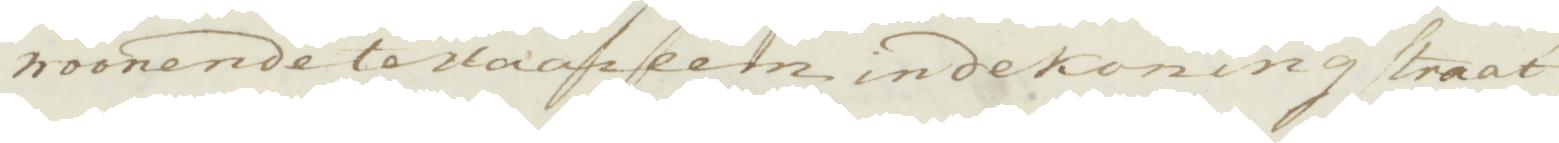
woonende te Haarlem, in de koning straat
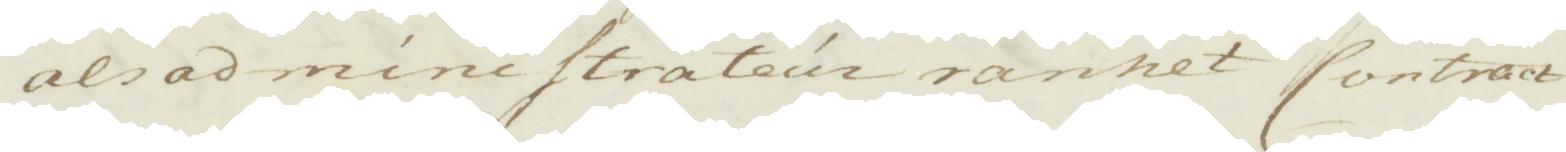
als administrateur van het Contract
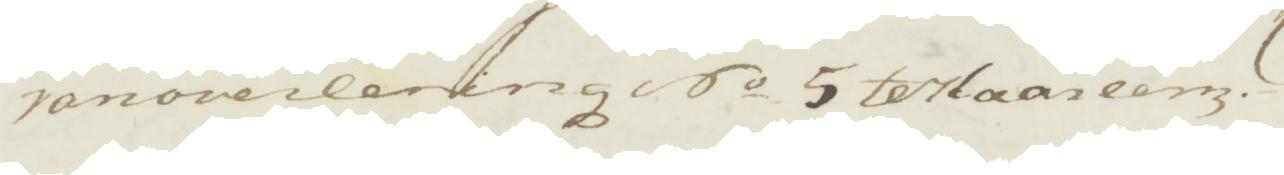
van overleving N-o 5 te Haarlem.
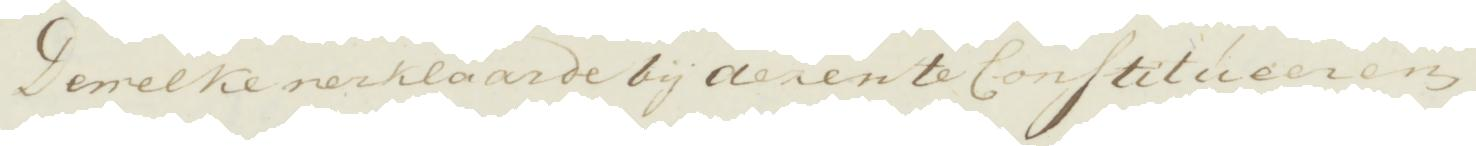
Dewelke verklaarde bij dezen te constitueeren,
